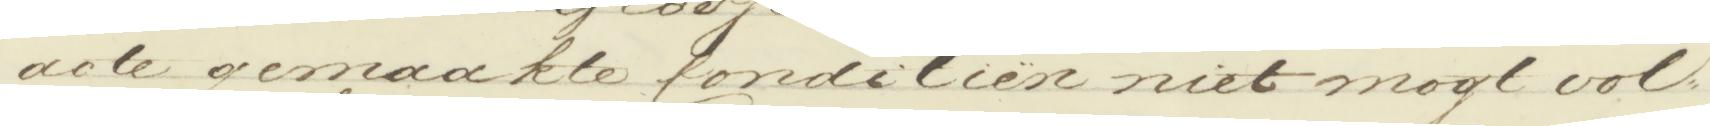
acte gemaakte Conditien niet mogt vol„
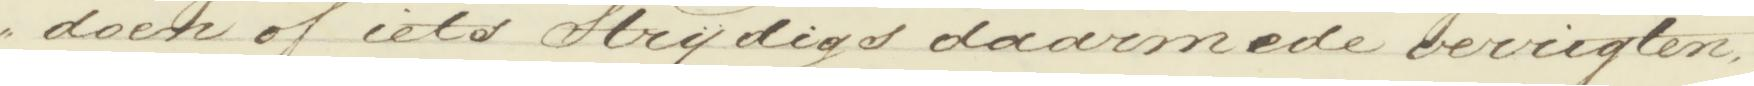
„doen of iets strijdigs daarmede verrigten,
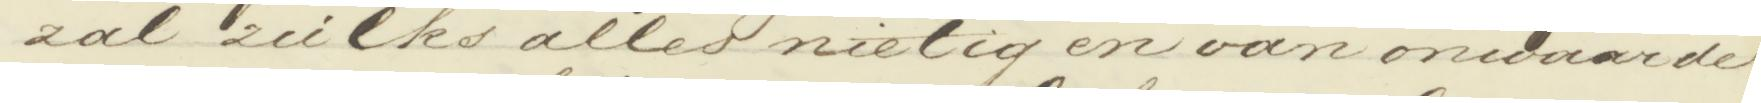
zal zulks alles nietig en van onwaarde
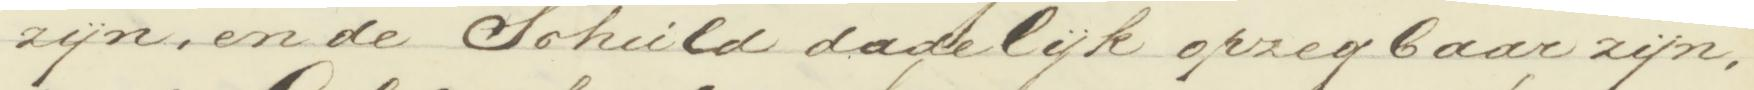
zijn, en de schuld dadelijk opzegbaar zijn,
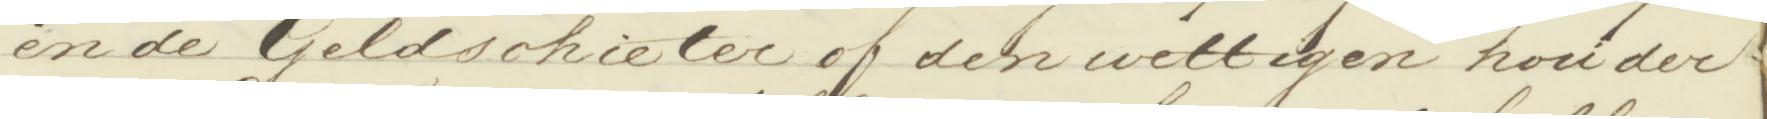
en de Geldschieter of den wettigen houder
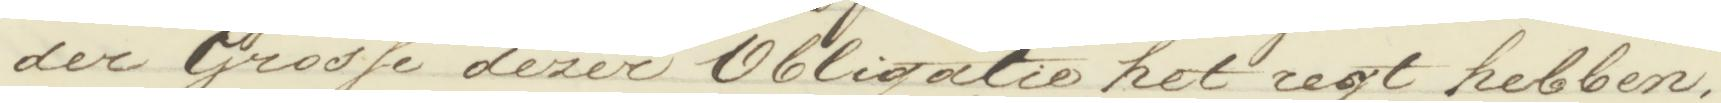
der Grosse dezer Obligatie het regt hebben,
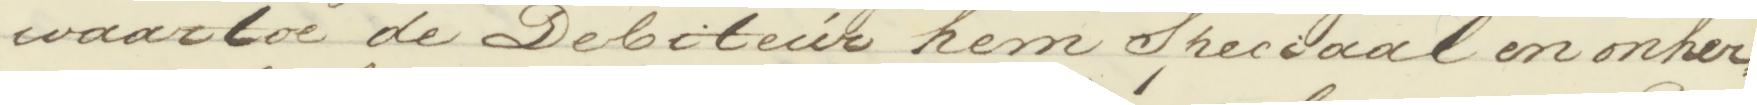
waartoe de Debiteur hem speciaal en onher„
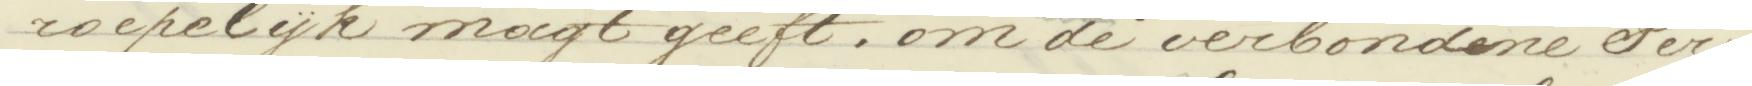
roepelijk magt geeft, om de verbondene Per„
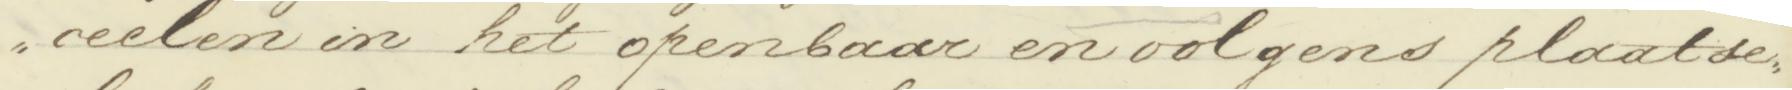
„ ceelen in het openbaar en volgens plaatse„
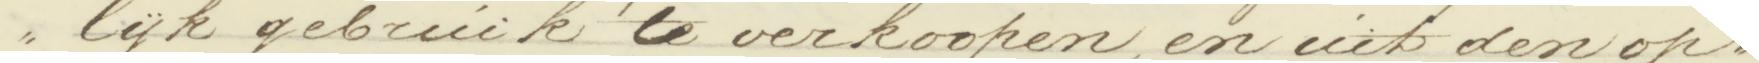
„ lijk gebruik te verkoopen, en uit den op„
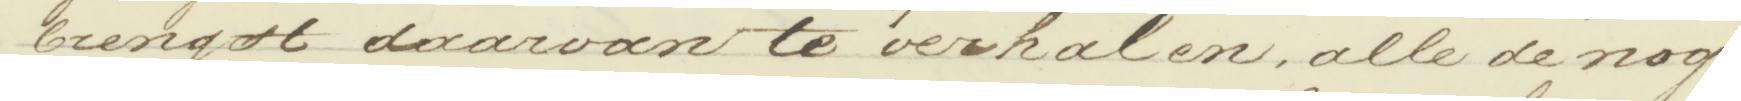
brengst daarvan te verhalen, alle de nog
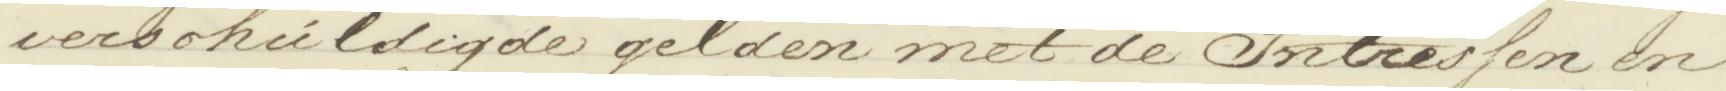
verschuldigde gelden met de Intressen en
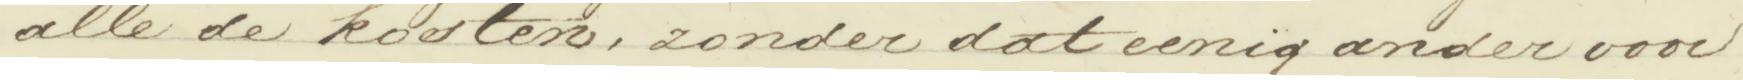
alle de kosten, zonder dat eenig ander voor
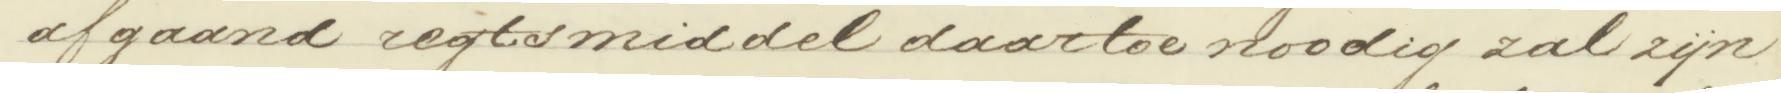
afgaand regtsmiddel daar toe noodig zal zijn
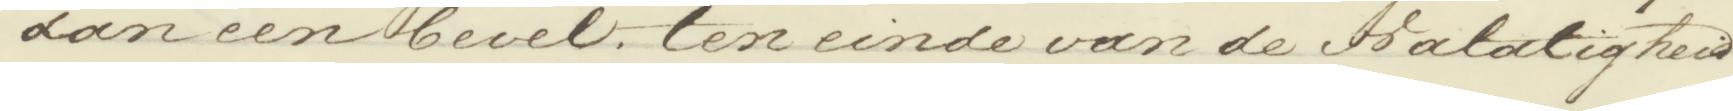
dan een bevel, ten einde van de Nalatigheid
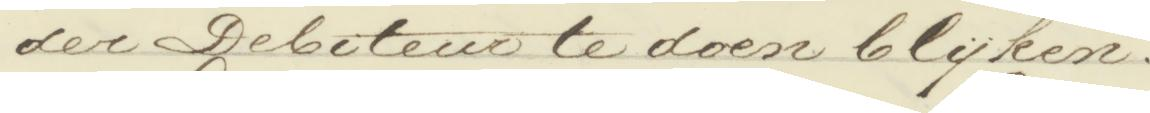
der Debiteur te doen blijken.
